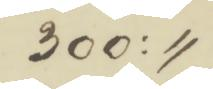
300: „
